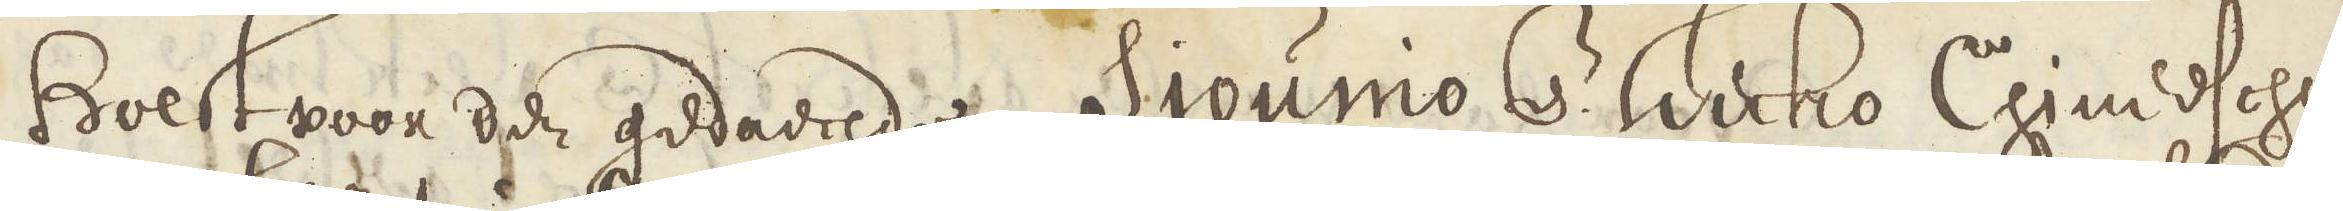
holst voor den gedaechde Siounio ende teecko Chineesche
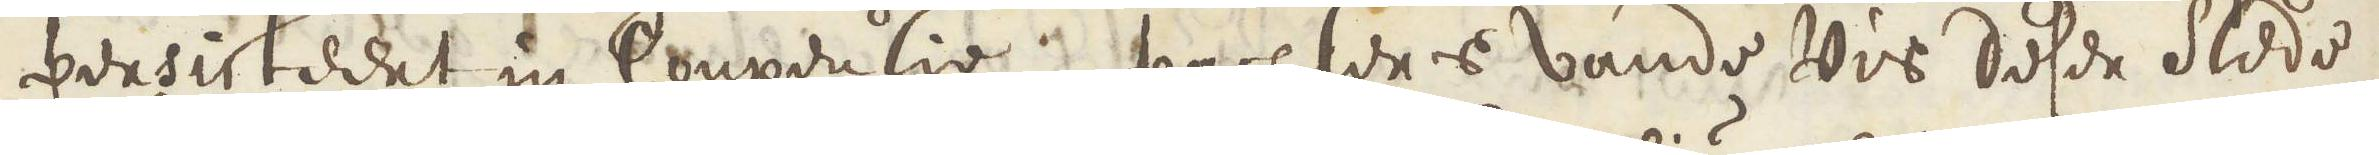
persisteert in Conventie pachters vande Vis deser stede
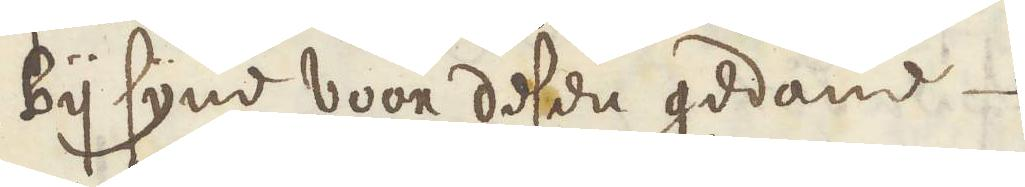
bij sijne voor desen gedane —
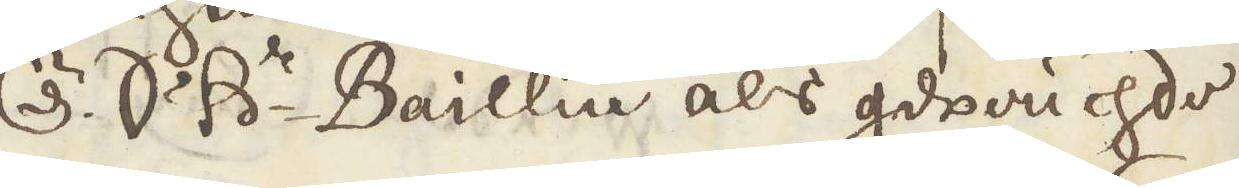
ende d' H=r Bailliu, als geveuchde
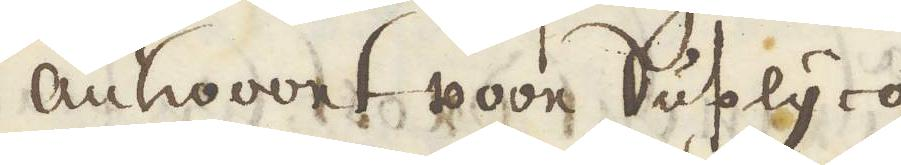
antwoort voor Duplijcq
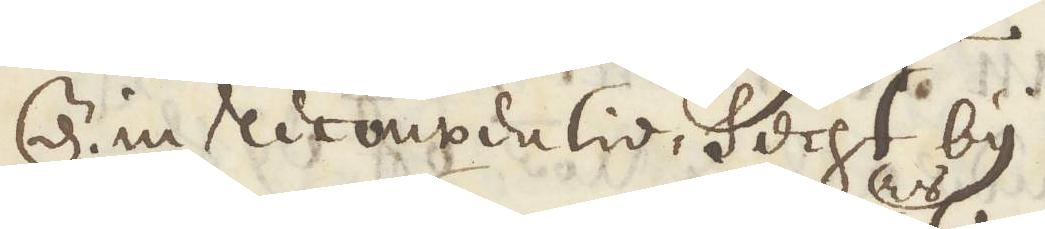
ende in reconventie, secht bij
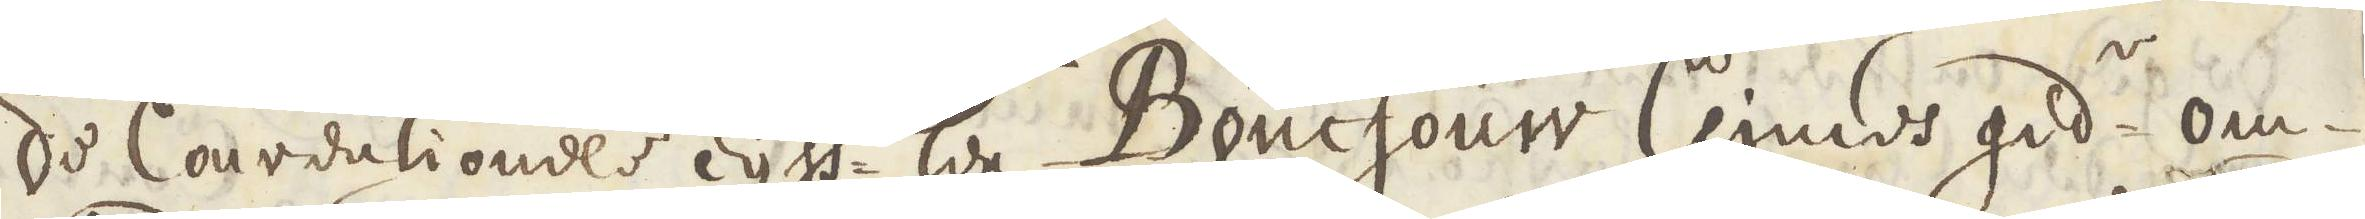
de Conventionele eijss=rs ter Boncjouw Chinees ged=e om -
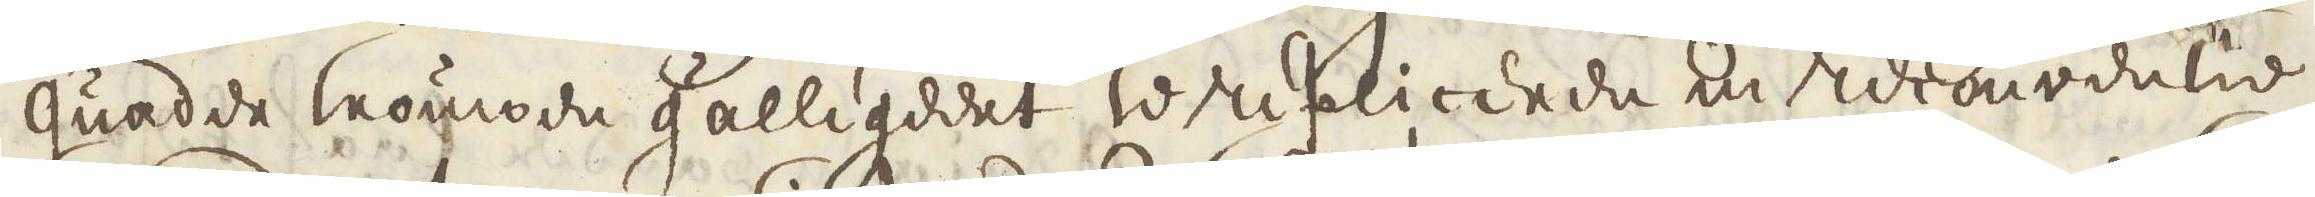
quader trouwen g’alligeert te repliceren in reconventie
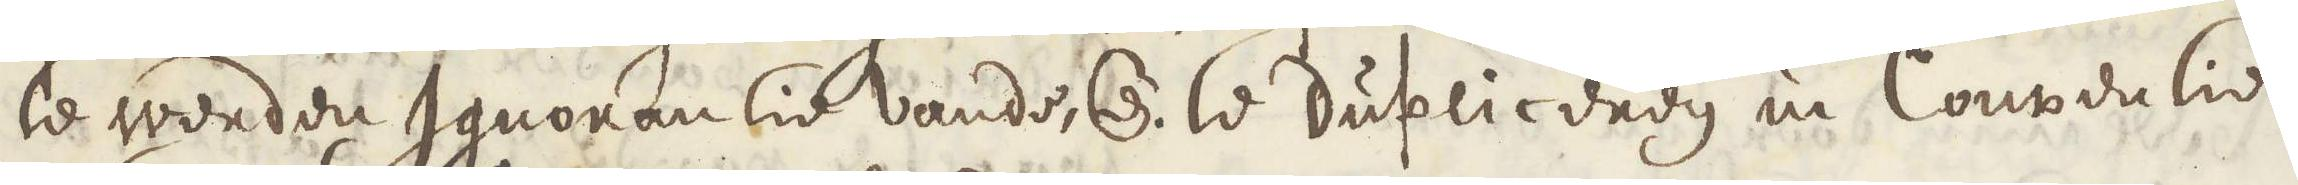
te werden ignorantie vande, ende te dupliceren in Conventie
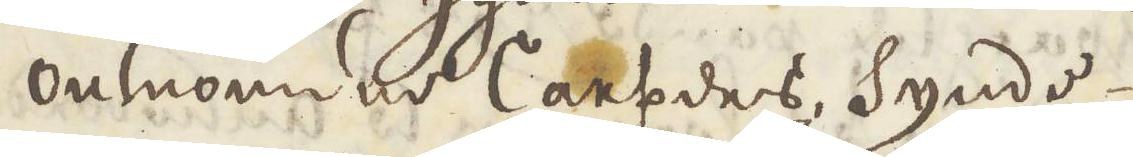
ontnomene Carpers, synde
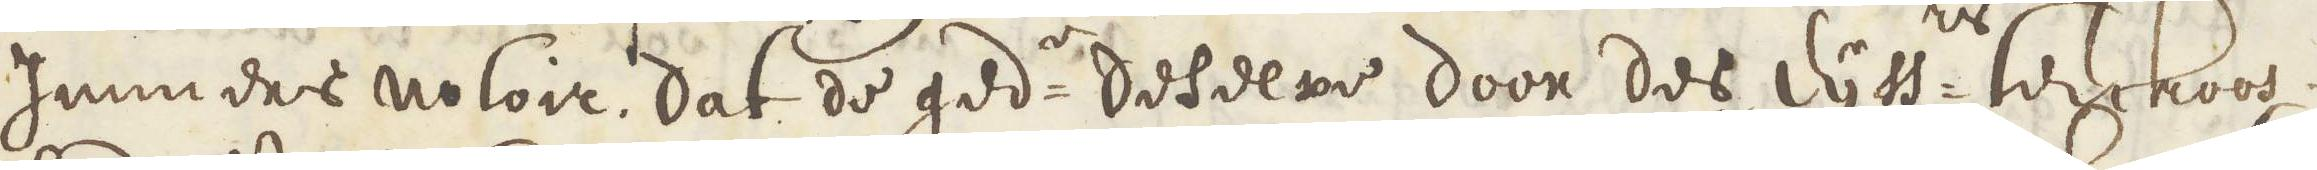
Jmmers notoir dat de ged=e deselve door des Eijss=rs teekoos
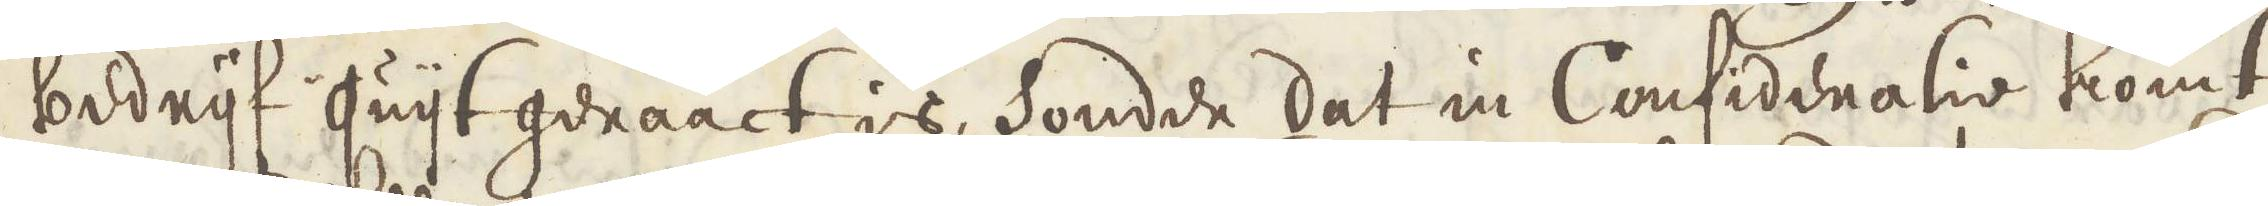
bedrijf quijtgeraact is, sonder dat in Consideratie komt
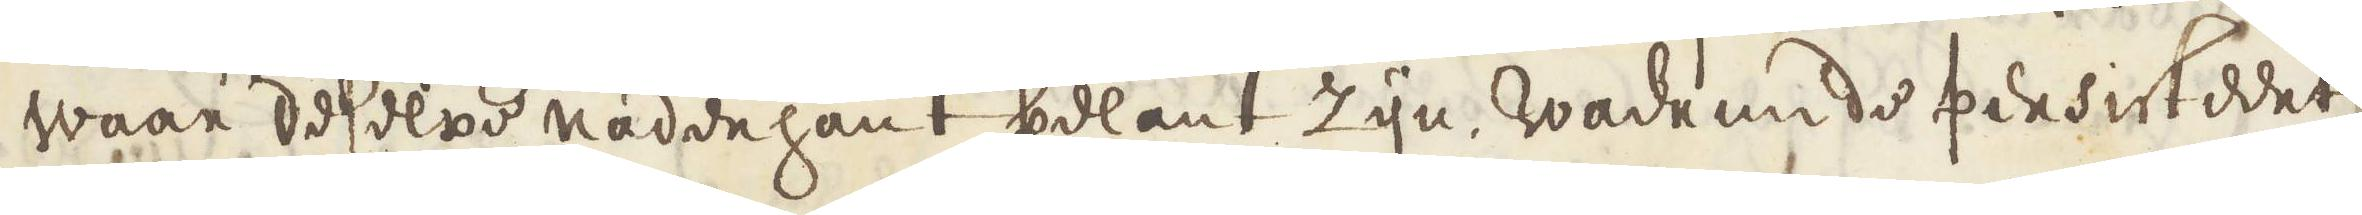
waar deselve naderhant belant zijn, waermede persisteert
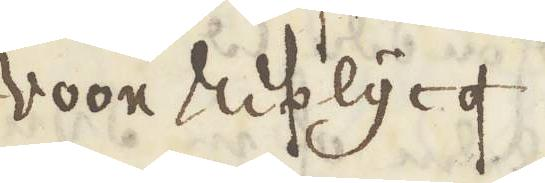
voor replijcq
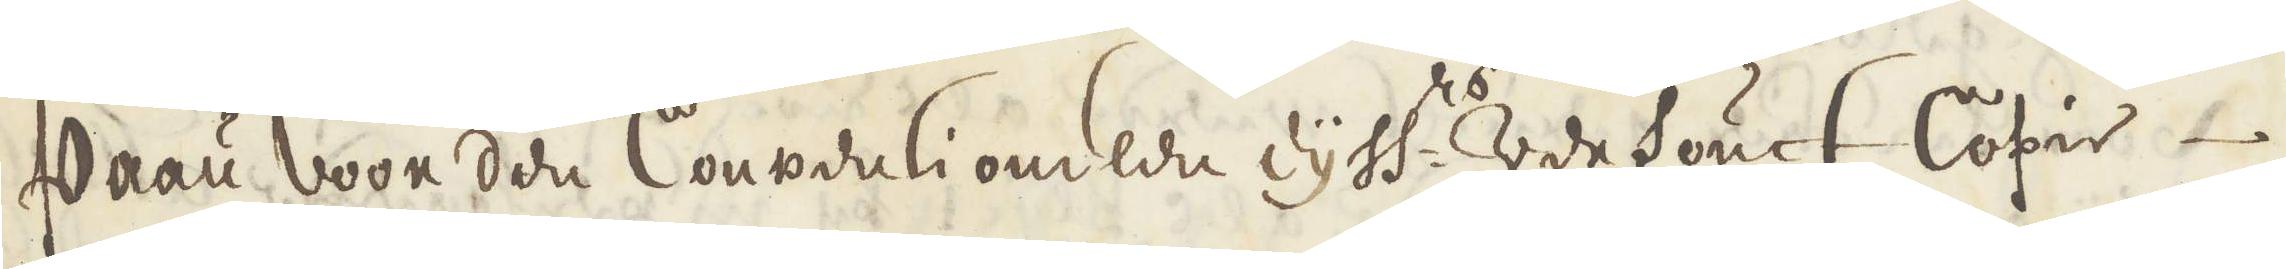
Paau voor den Conventionelen Eijs=rs versouct Copie—
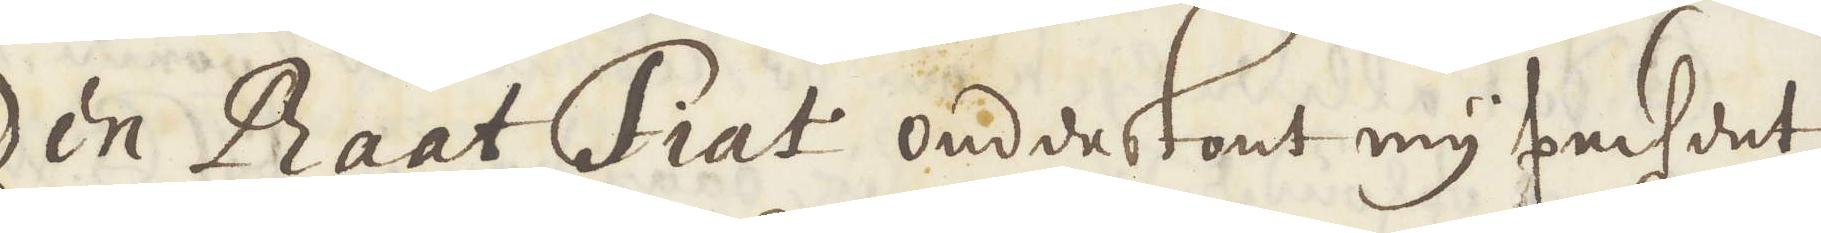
Den Raat Fiat onderstont mij present
